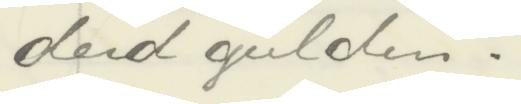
derd gulden.
